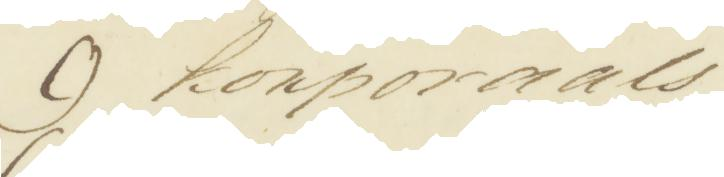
9 korporaals
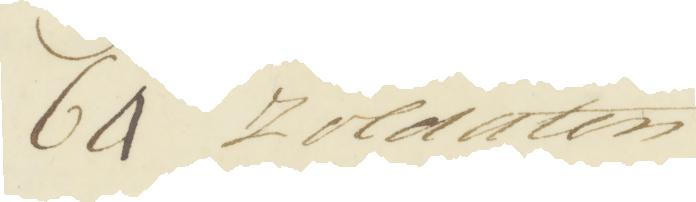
64 zoldaten
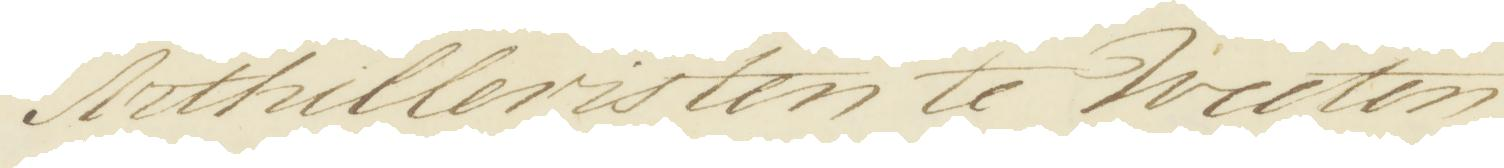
Arthilleristen te weeten
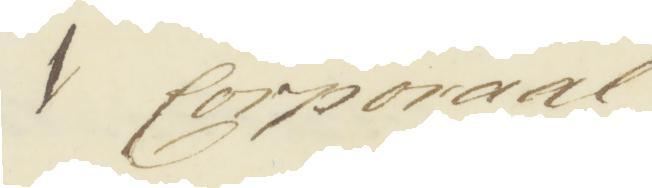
1 Corporaal
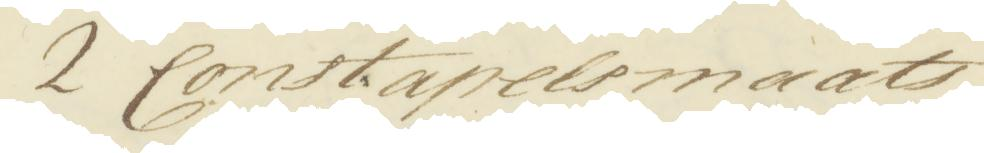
2 Constapelsmaats
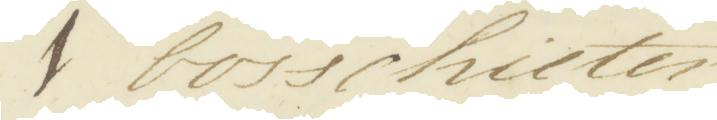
1 bosschieter
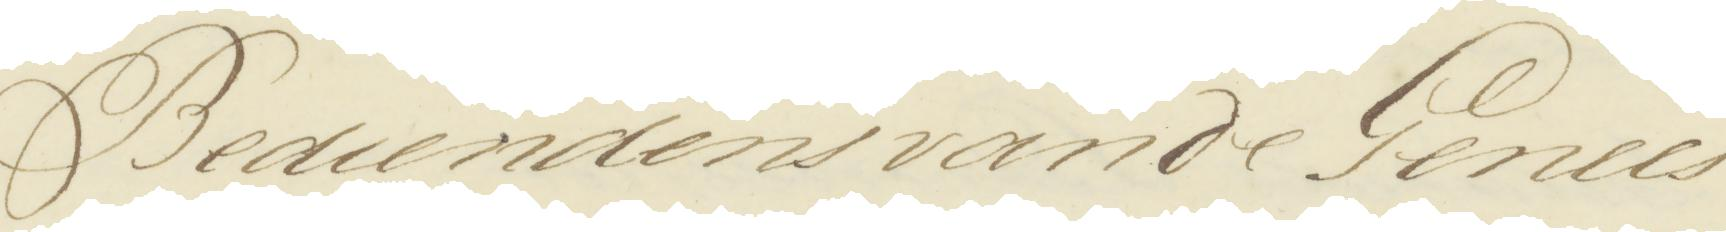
Bediendens van de Genees
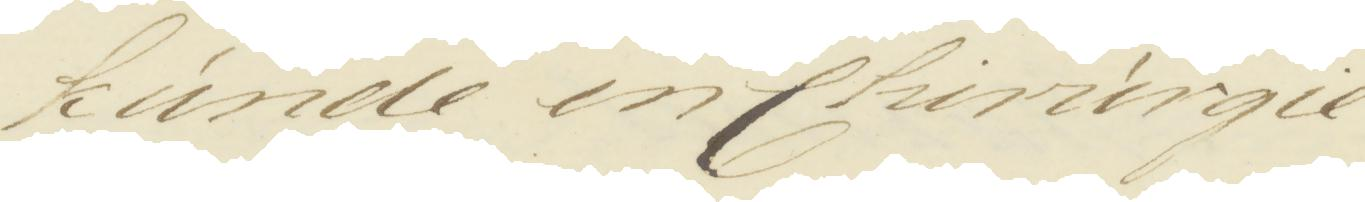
kunde en Chirurgie
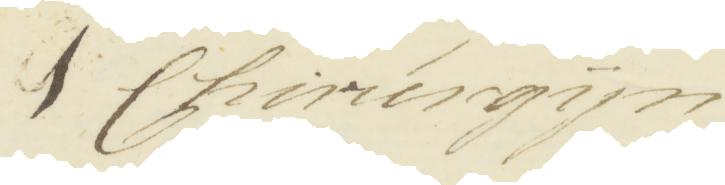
1 Chirurgijn
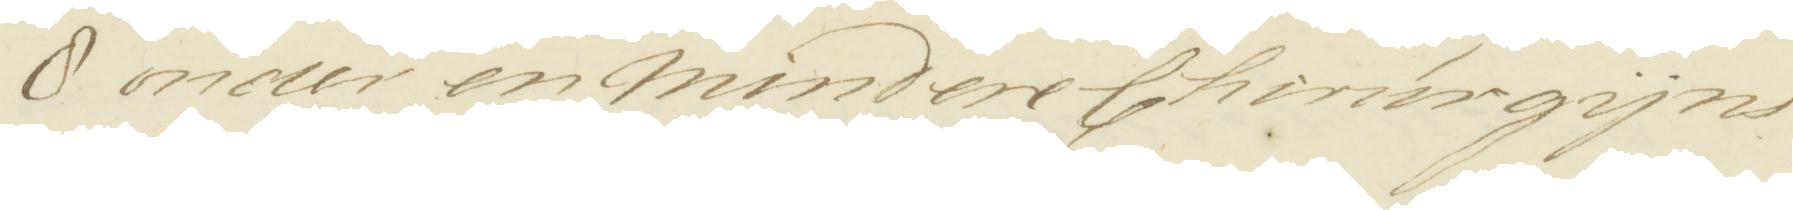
8 onder en mindere Chirurgijns
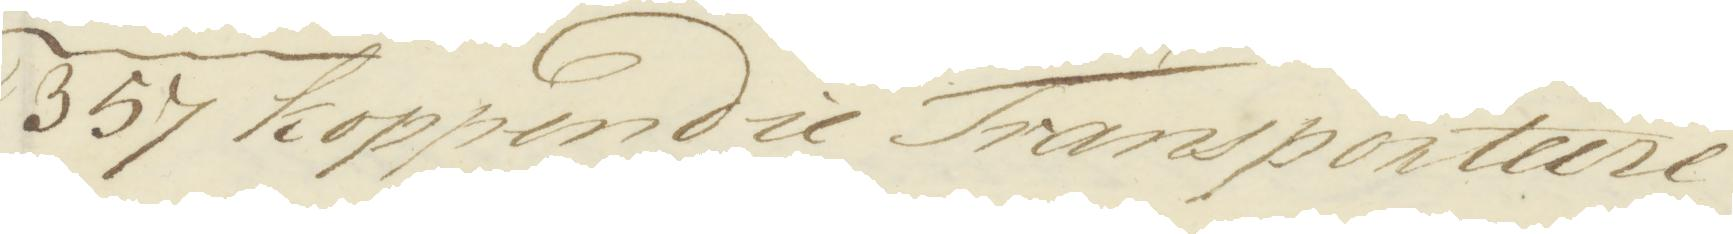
357 koppen die Transporteere
